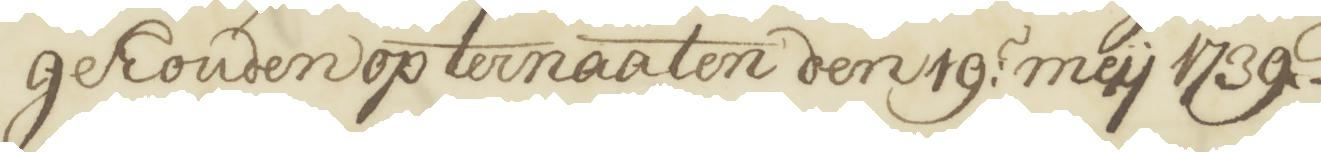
gehouden op ternaaten den 19:' meij 1739.
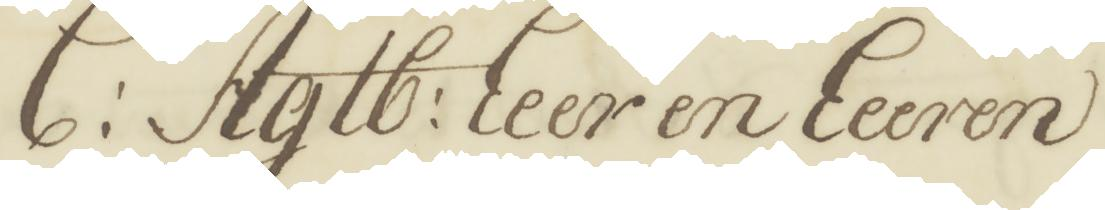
E: Agtb: heer en heeren
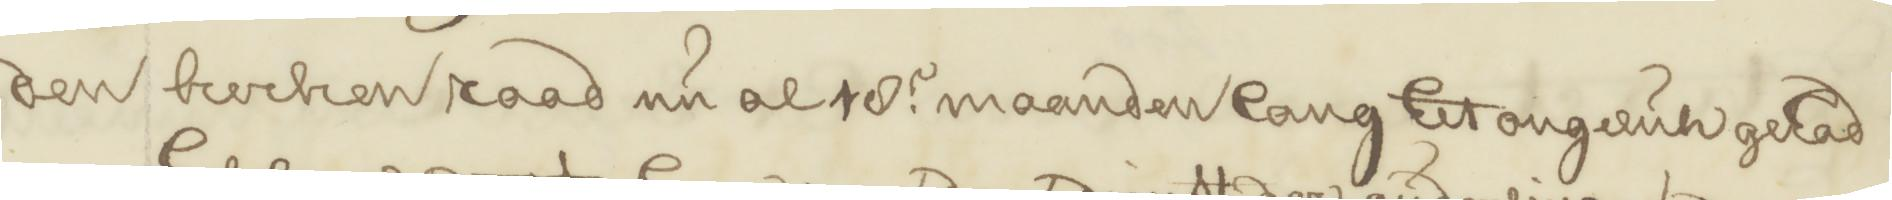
den kerken raad nu al 18:' maanden lang het ongeluk gehad
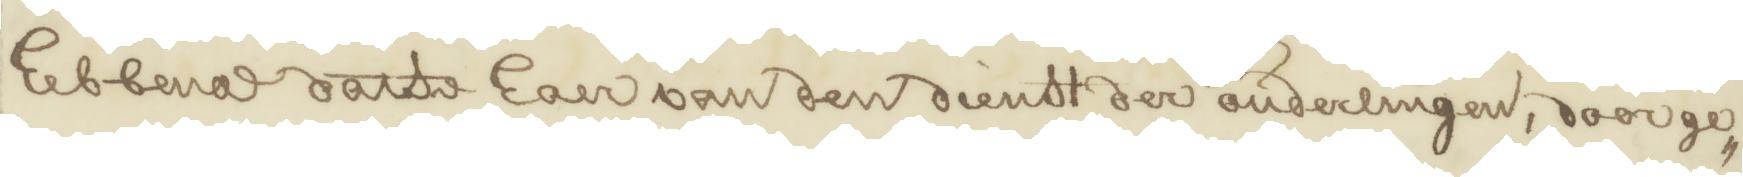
hebbende datse haer van den dienst der ouderlingen, door ge
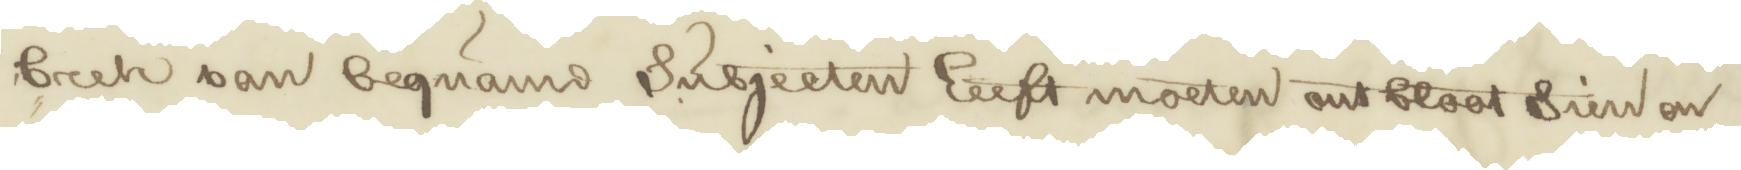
brek van bequame subjecten heeft moeten ontbloot sien en
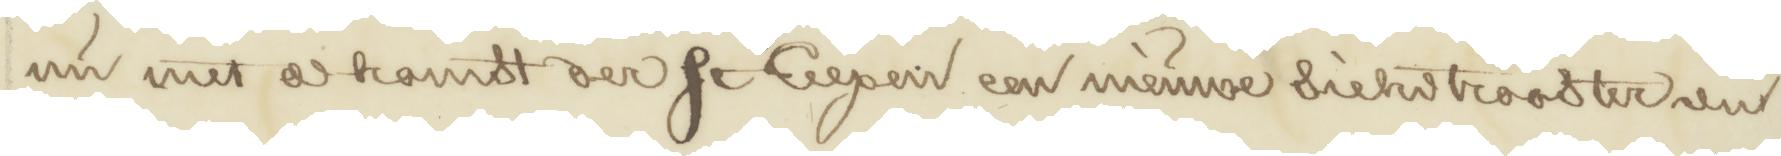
nu met de komst der scheepen een nieuwe sieketrooster en
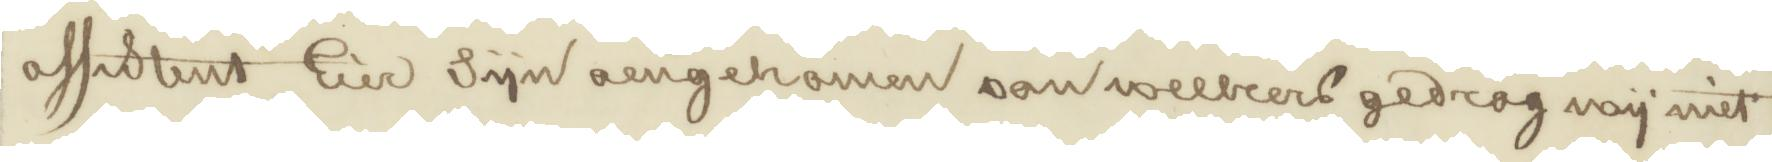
assistent hier sijn aengekomen van welkers gedrag wij niet
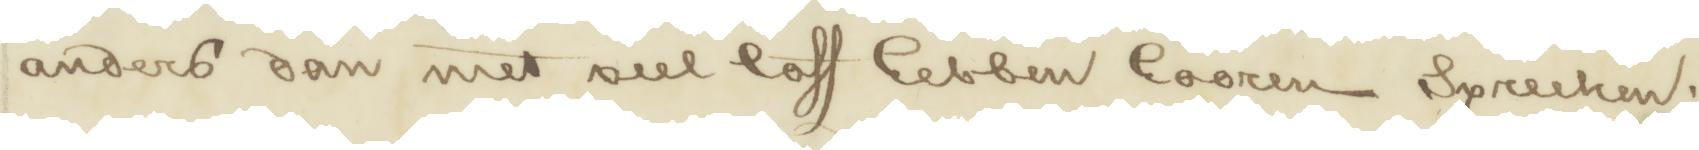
anders dan met veel loff hebben hooren spreeken
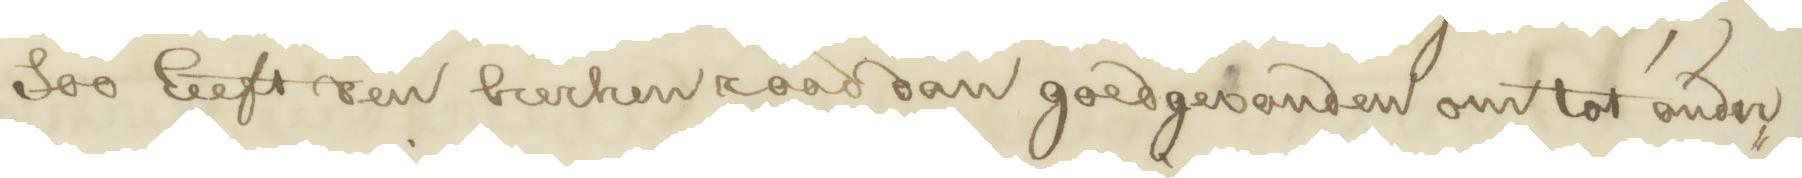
soo heeft den kerken raad dan goedgevonden om tot ouder„
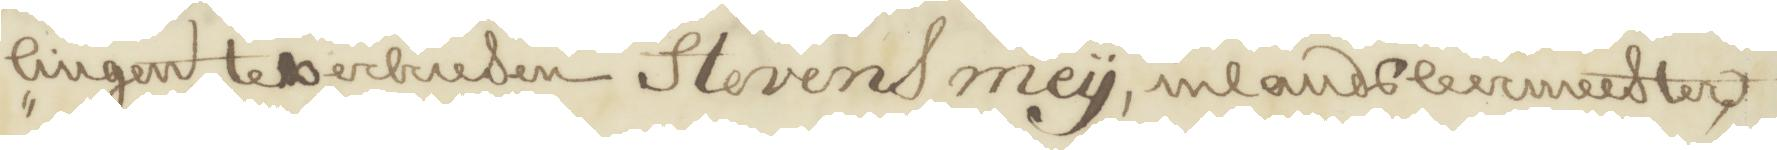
„lingen te verkiesen stevens meij, inlands leermeester,
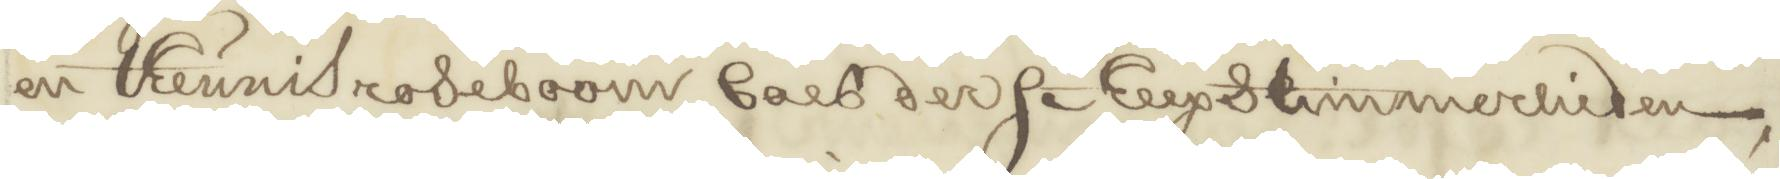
en theunis roseboom baes der scheepstimmerlieden
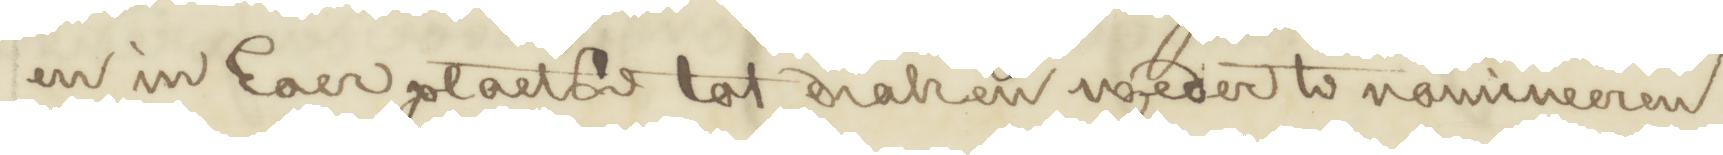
en in haer plaetse tot diaken weder te nomineeren
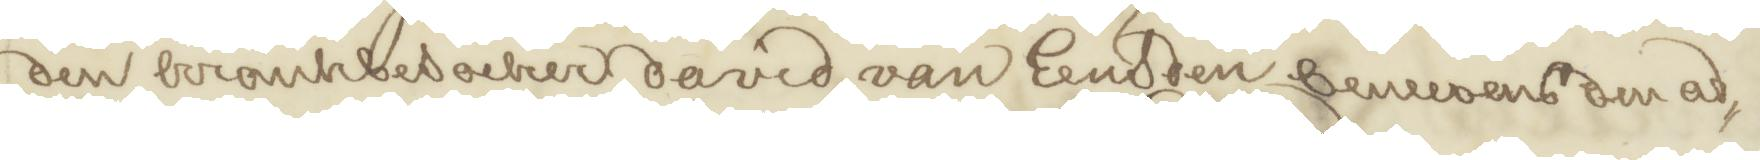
den krankbesoeker david van heusden beneevens den ad„
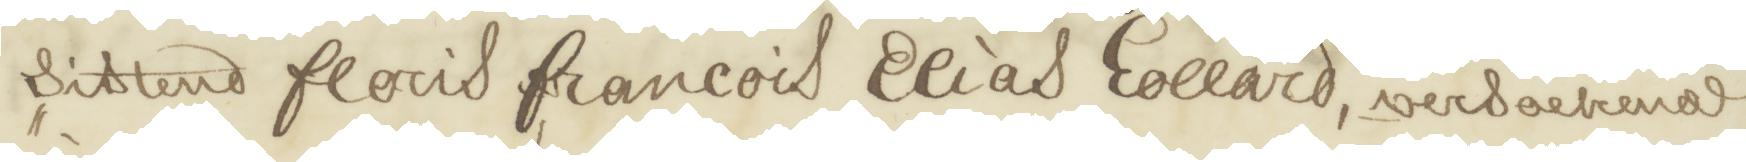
sistend floris francois Elias hollard, versoekende
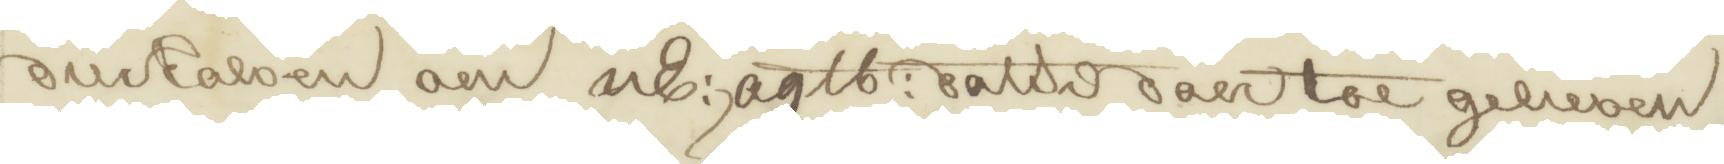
dier halven aen uE: agtb: datse daer toe gelieven
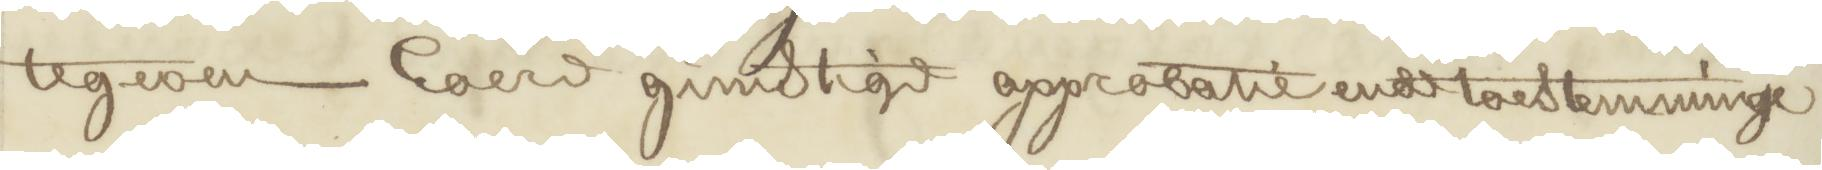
tegeven haere gunstige approbatie ende toestemminge
